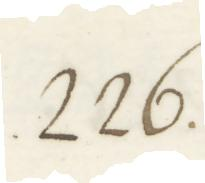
226.
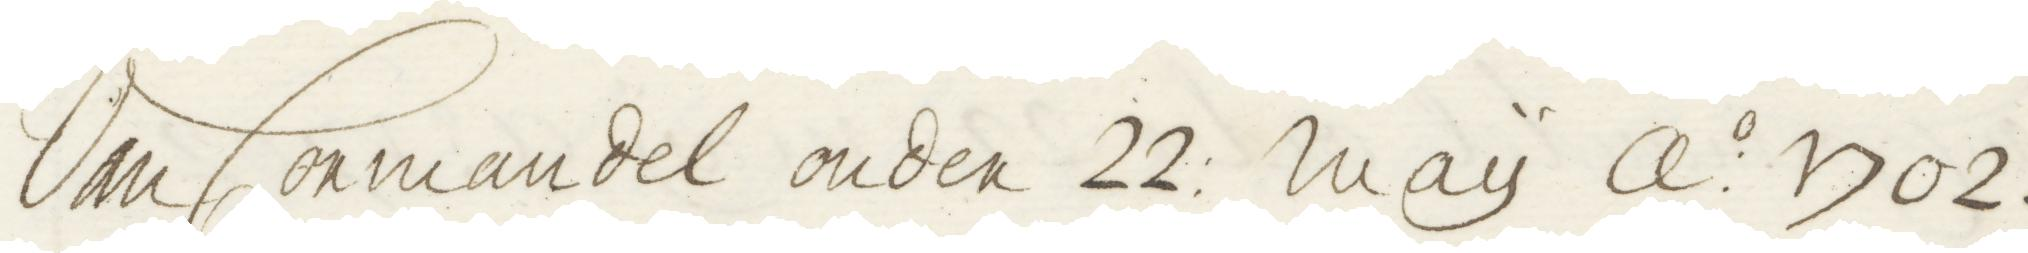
Van Cormandel onder 22: Maij A:o 1702
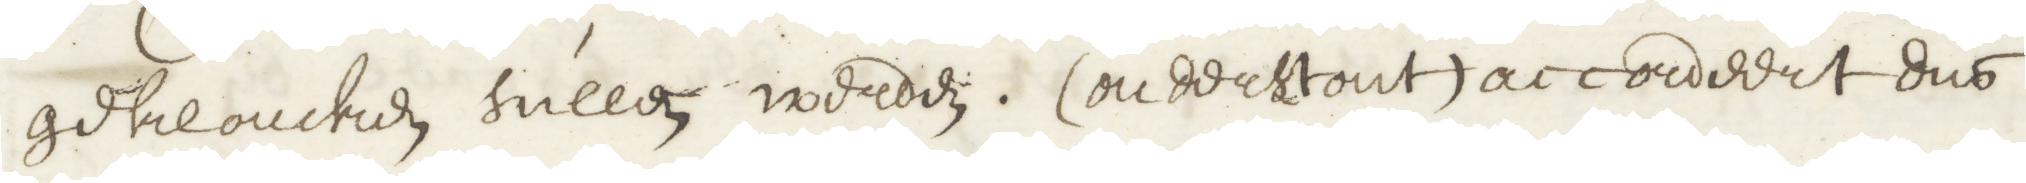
gekloncken sullen werden. (onderstont) accordeert dus
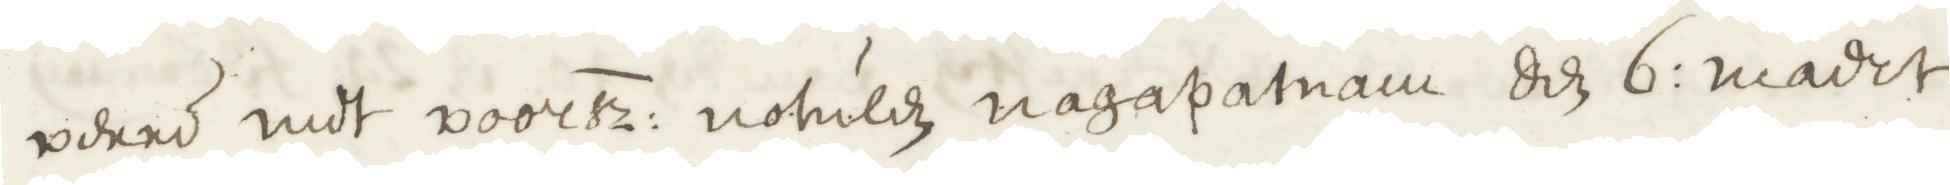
verre met voorsz: notulen nagapatnam den 6: maert
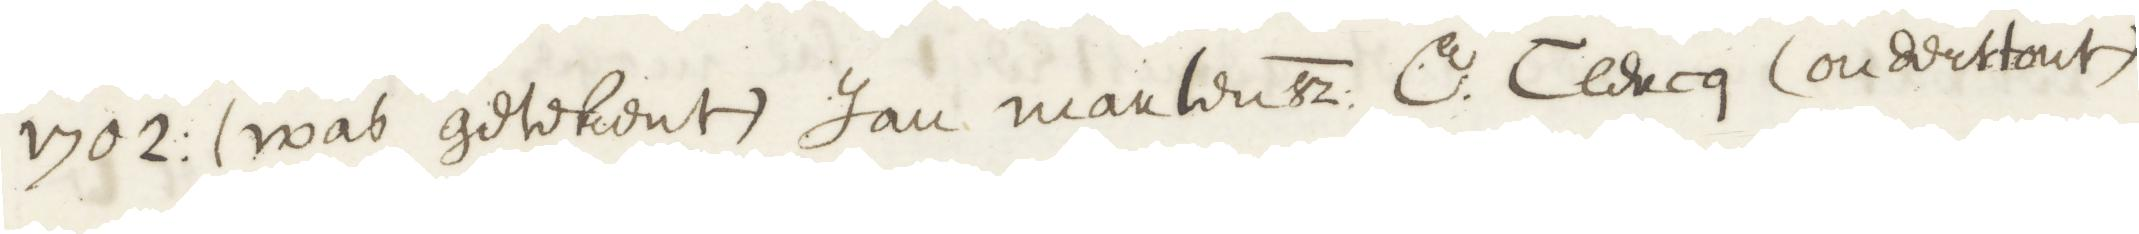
1702: (was getekent) Ian martensz: C:s Clercq (onderstont)
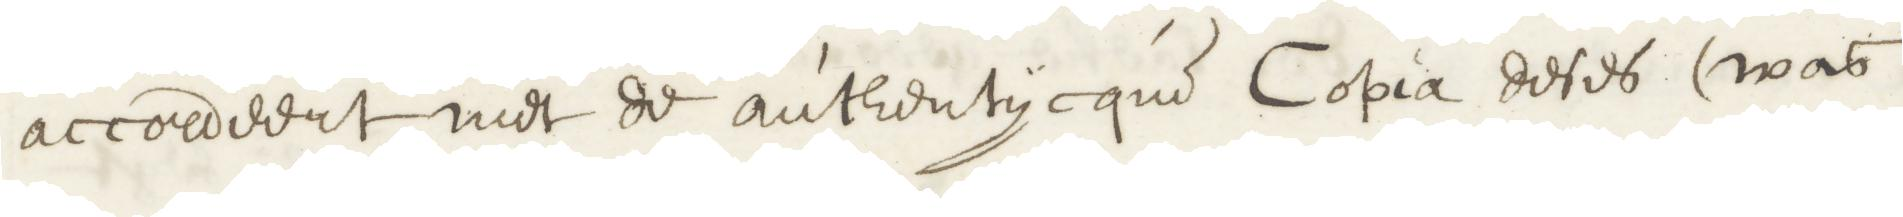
accordeert met de authentijcque Copia deses (was
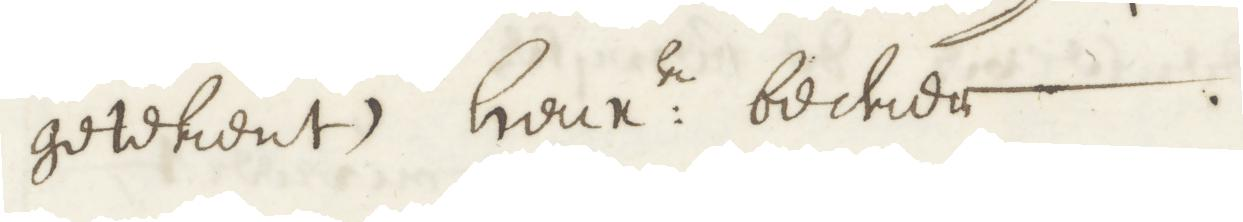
getekent) henr:k becker.
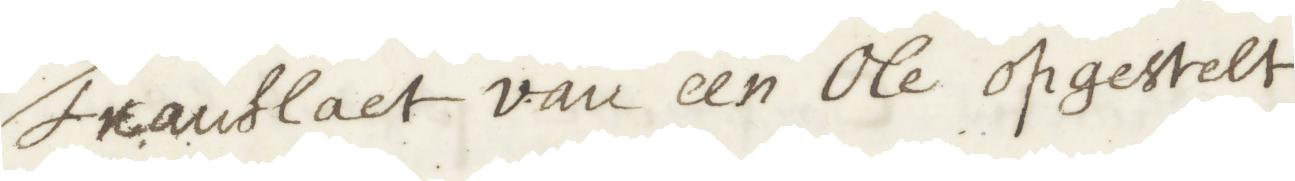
Translaet van een Ole opgestelt
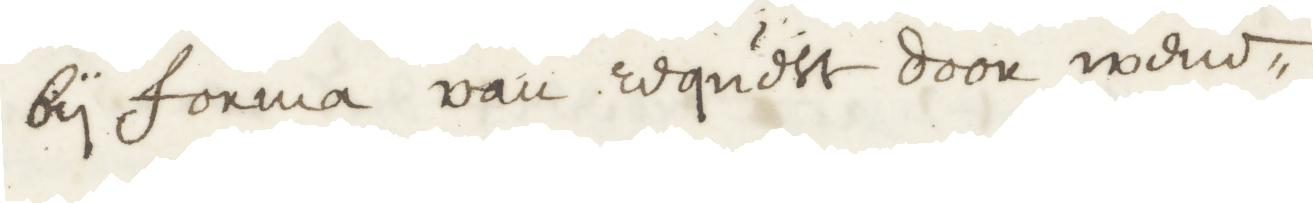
bij forma van request door wene„
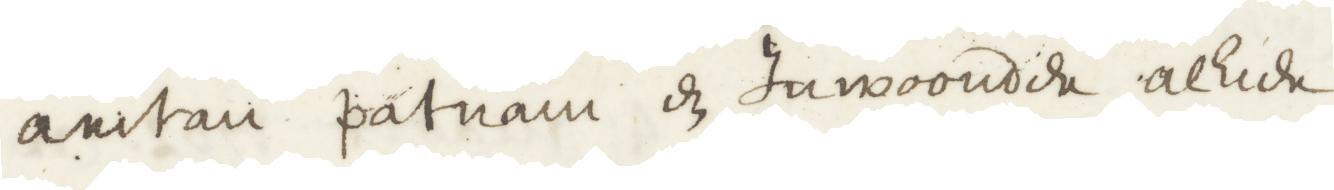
aritan patnam en Inwoonder alhier
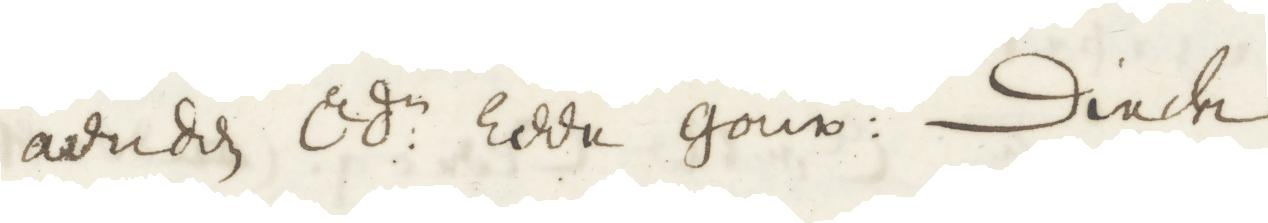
aen den Ed:e heer gouv:r Dirck
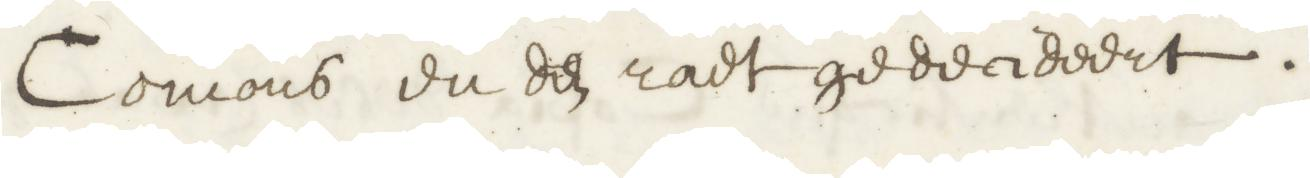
Comans en den raet gedecideert.
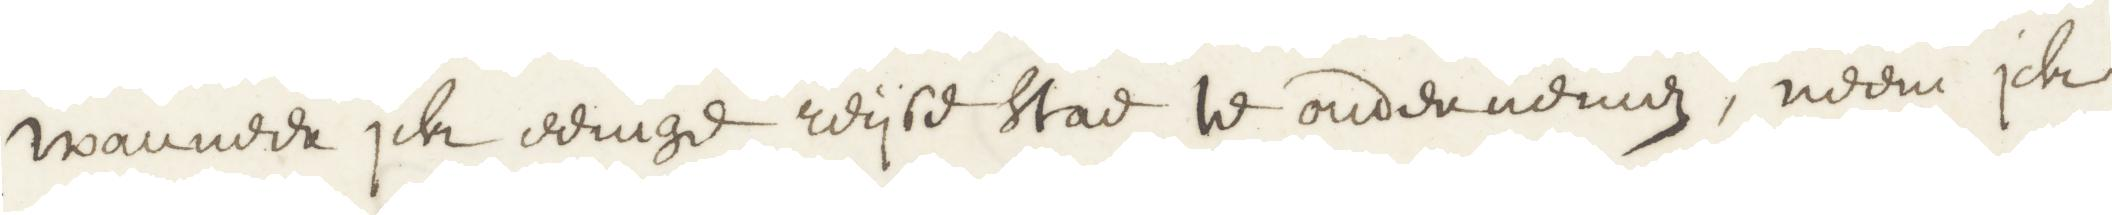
wanneer jck eenige reijse stae te ondernemen, neem jck
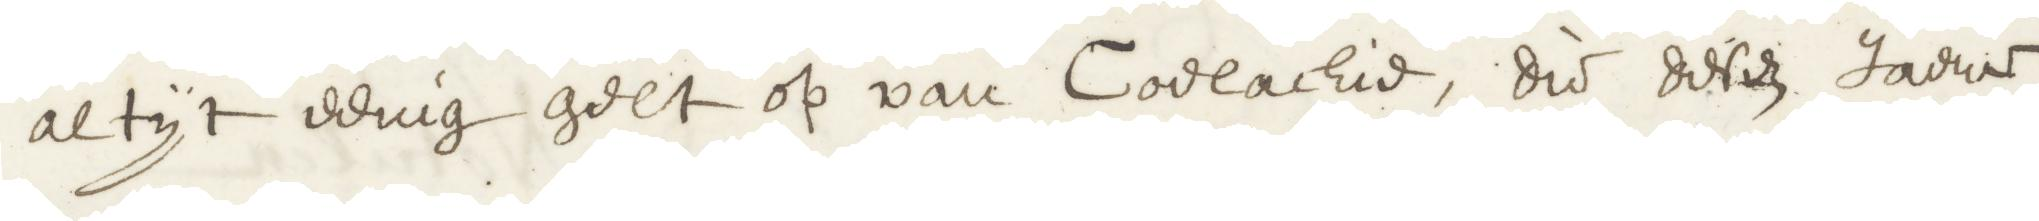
al tijt eenig gelt op van Coelachie, die desen Iaere
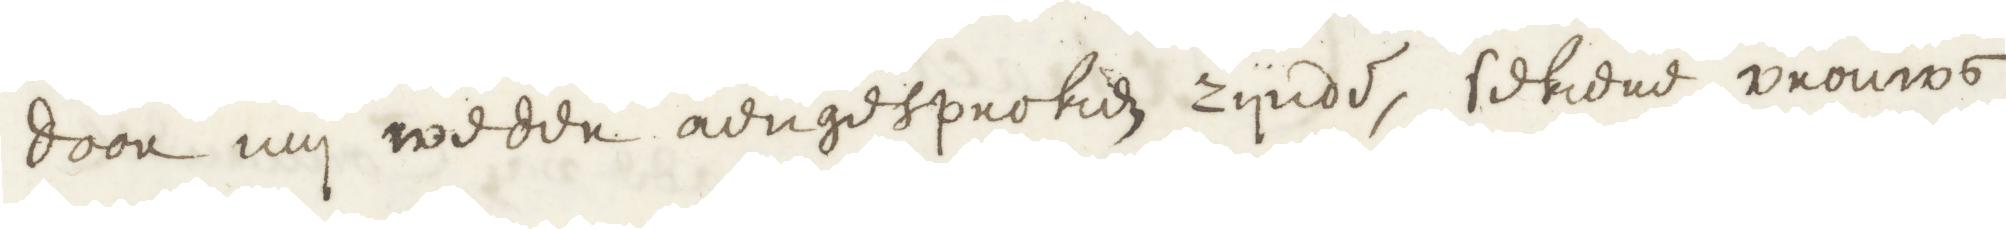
door mij weder aengesproken zijnde, sekere vrouws
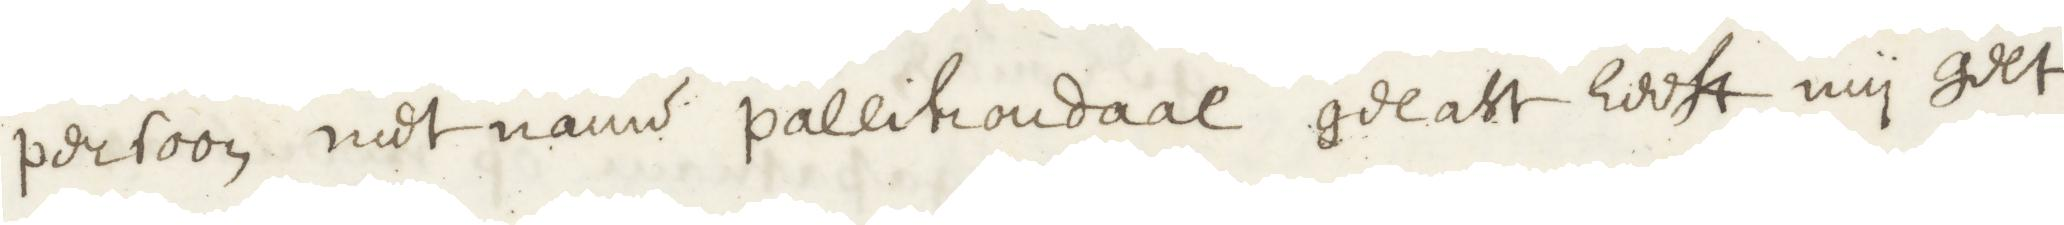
persoon met name pallikondaal gelast heeft mij gelt
